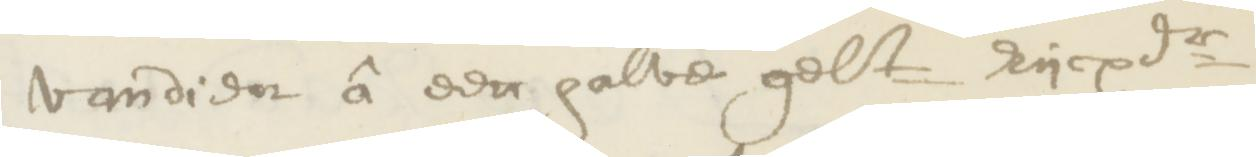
van dien â een halve gelt rijcxd=r
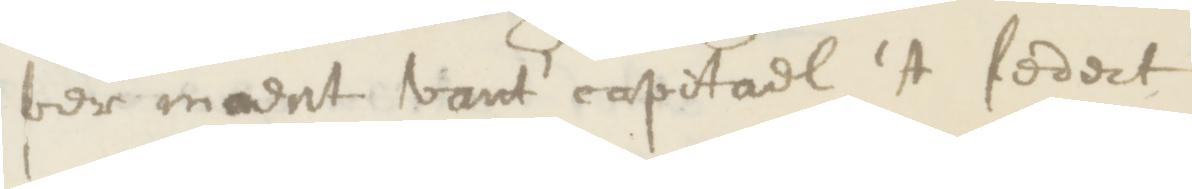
ter maent vant' capitael ’t sedert
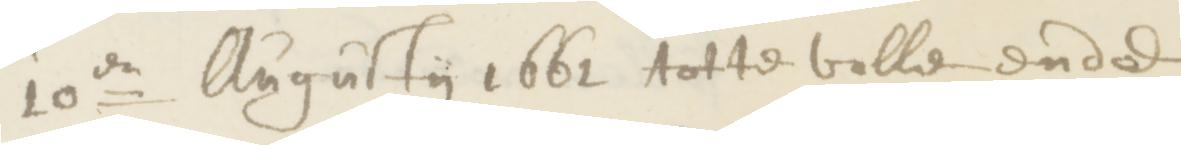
10=en Augustij 1662 tot te volle ende
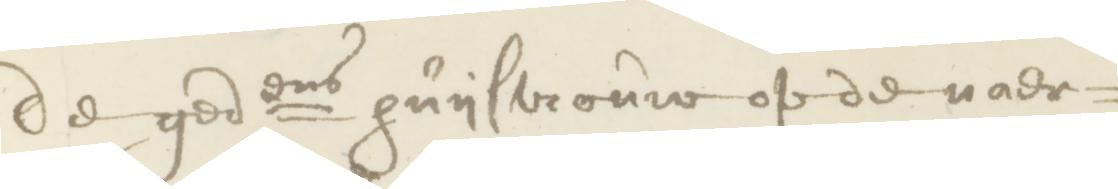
de ged=ens huijsvrouw op de naer=
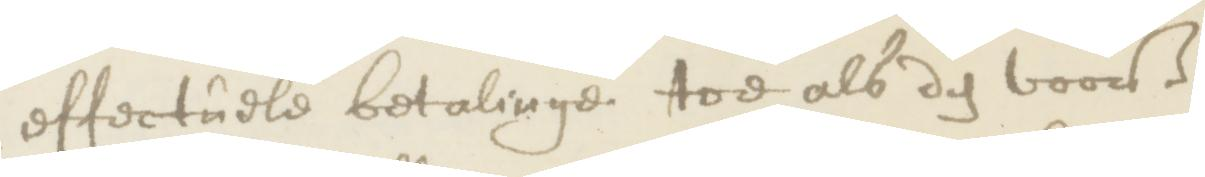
effectuele betalinge toe als den voorsz
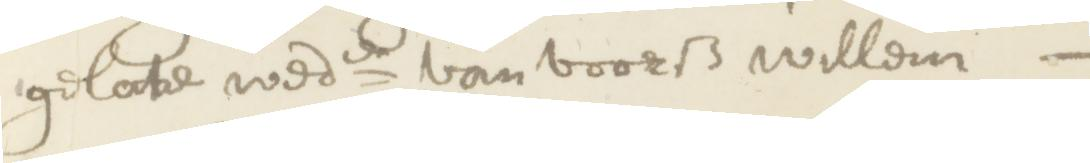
gelate wed=e van voorsz willem
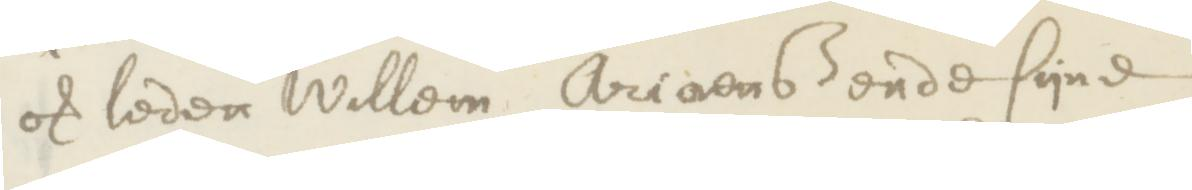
over leden Willem Ariaensz ende sijne
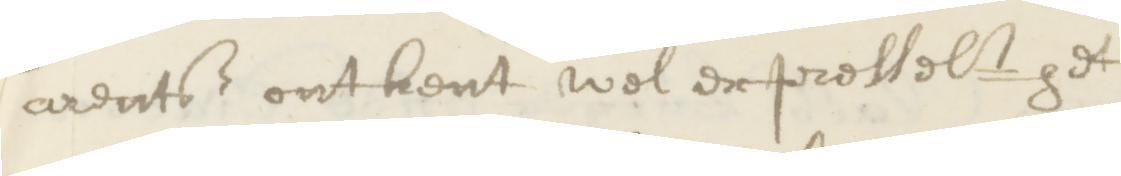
arentsz ontkent wel expresselijk het
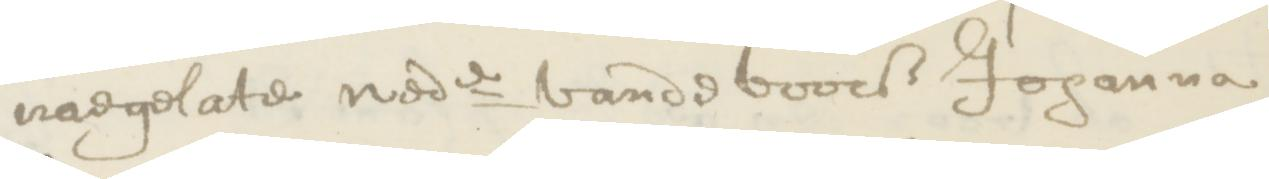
naegelate wed=e van de voorsz Johanna
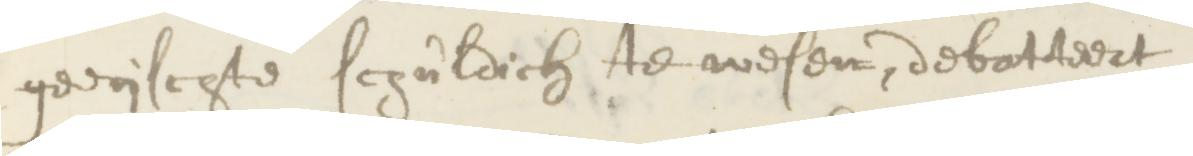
geeijschte schuldich te wesen, debatteert
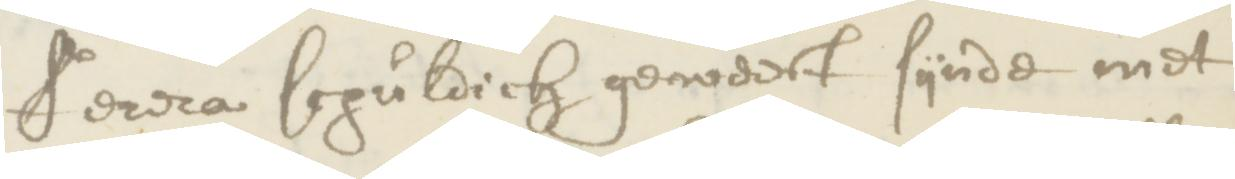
ferera schuldich geweest sijnde met
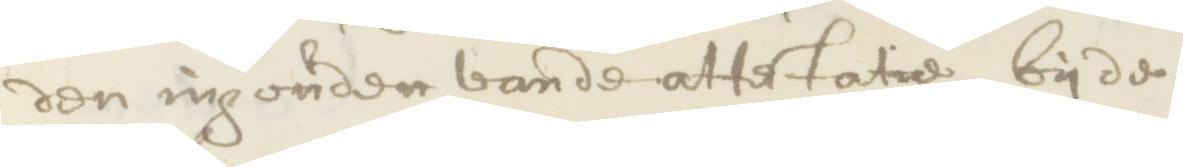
den inhouden van de attestatie bij de
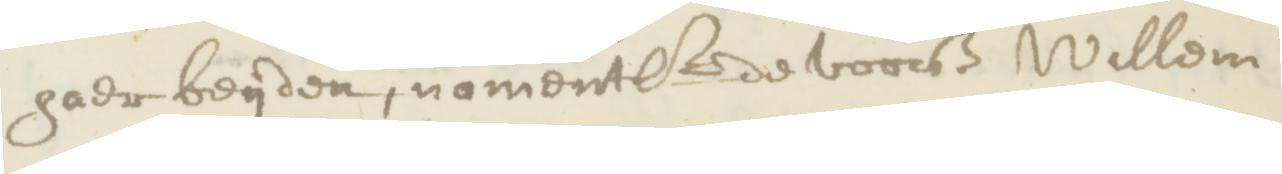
haer beijden, namentlijk de voorsz Willem
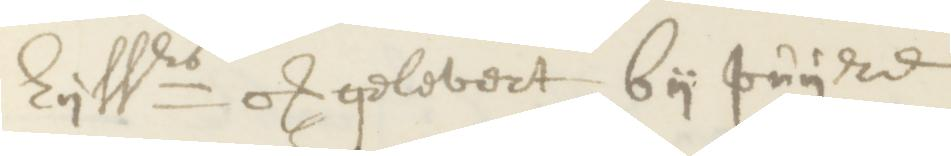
Eijss=rs overgelevert bij puijre
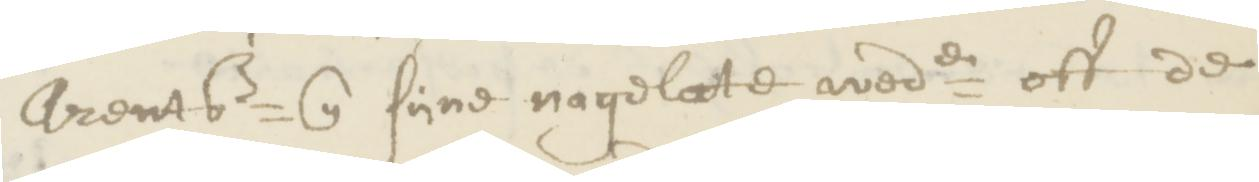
arentsz= ende sijne nagelate wed=e off de
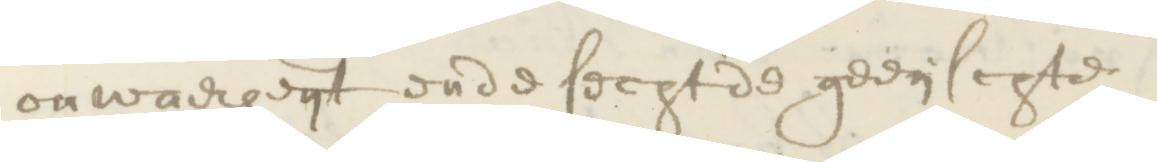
onwaerheyt ende secht de geeijschte
